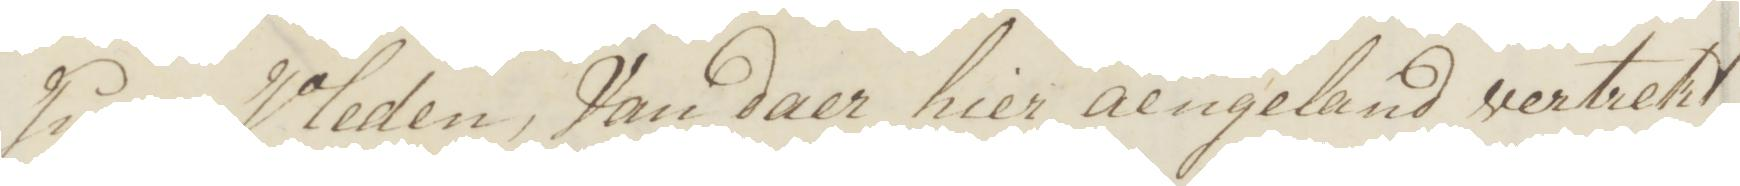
Junij Joleden, Van daer hier aengeland vertrekt
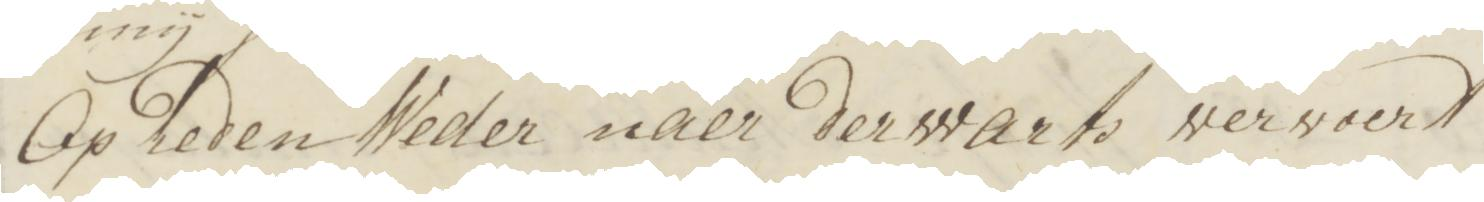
Op heden Weder naer derwarts vervoert
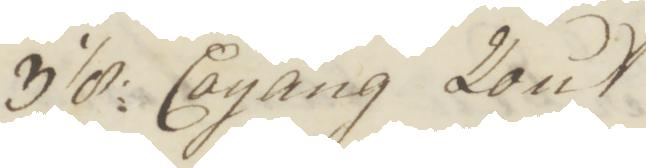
3 1/8: Coyang zout
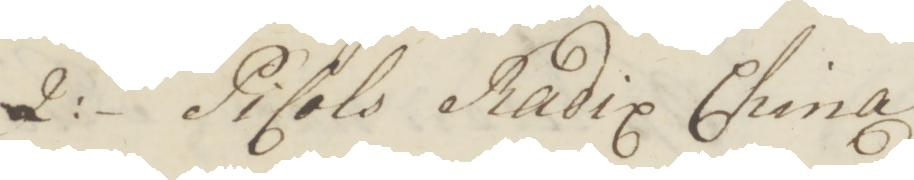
2:- Picols Radix China
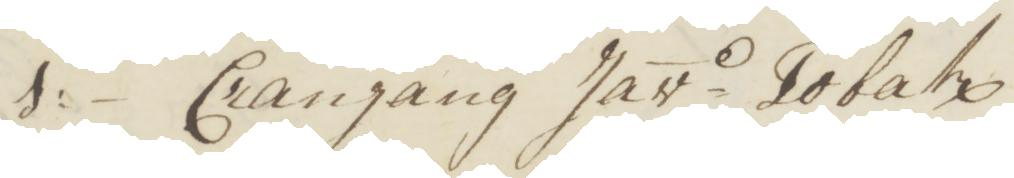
1:- Cranjang Jav=o Tabak
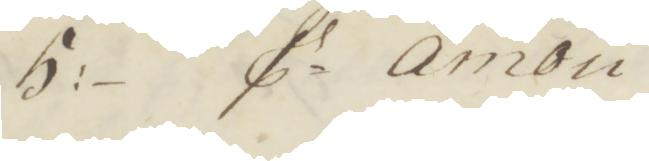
5:- p=s amou
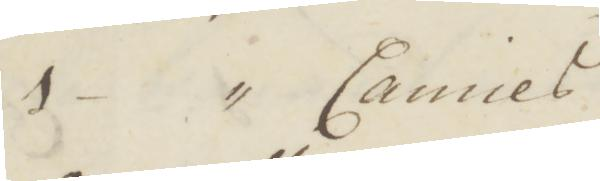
1- „ Camies
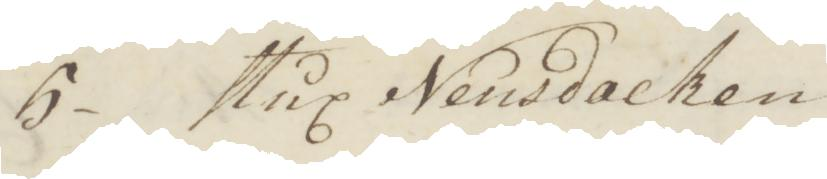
5- stux Neusdoeken
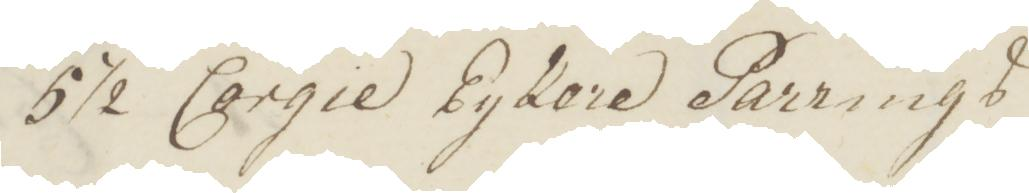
5½ Corgie Eyzere Parrings
